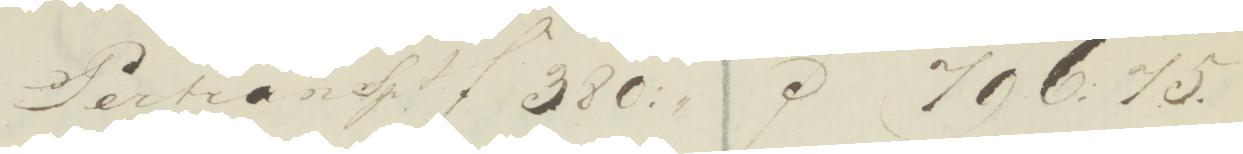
Per transp:t ƒ 380: „ ƒ 796: 75.
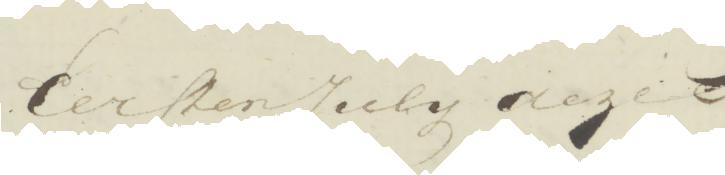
Eersten July deze
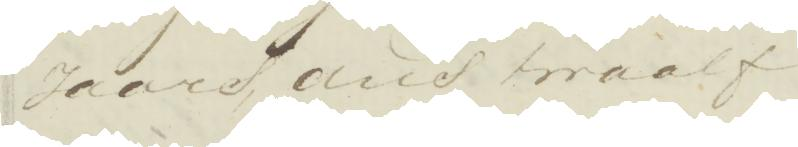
Jaars, dus twaalf
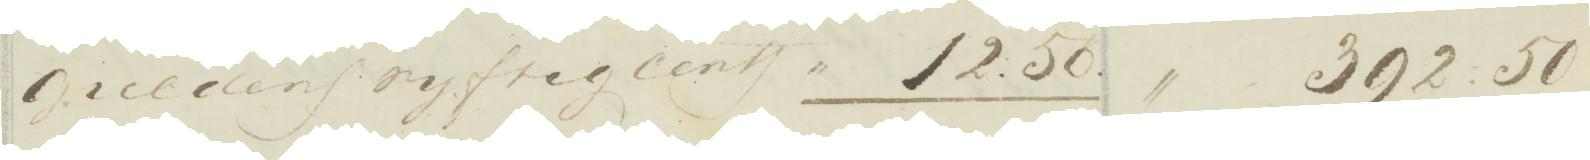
guldens vyftig cents „ 12:50. „ 392.50
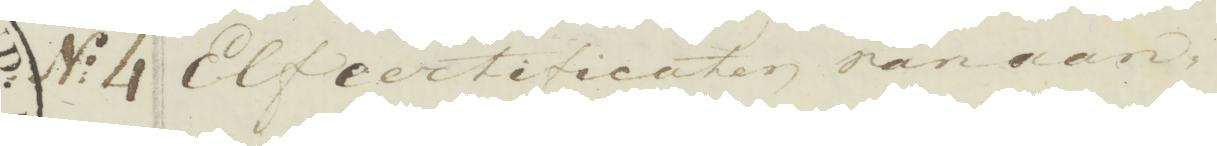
N=o 4 Elf certificaten van aan;
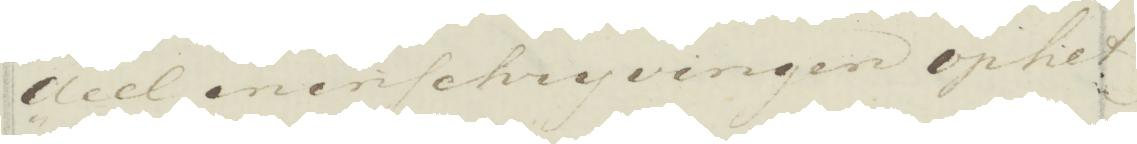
„deel en inschryvingen op het
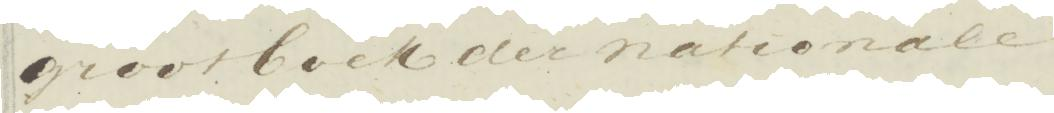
groot boek der nationale
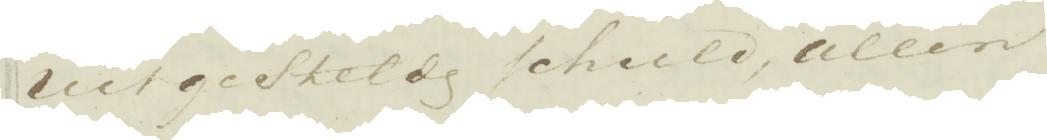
uitgestelde schuld, allen
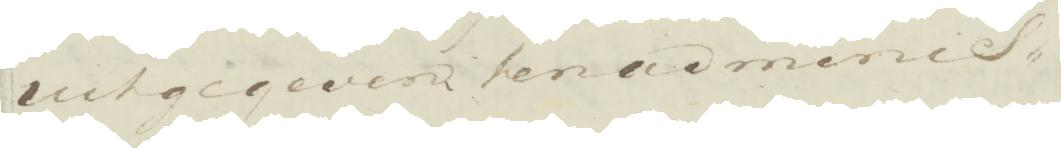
uitgegeven ten adminis„
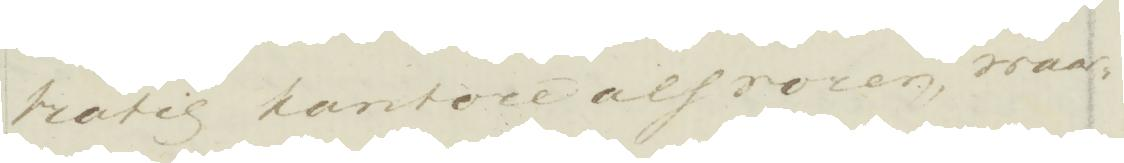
tratie kantore als voren, waar„
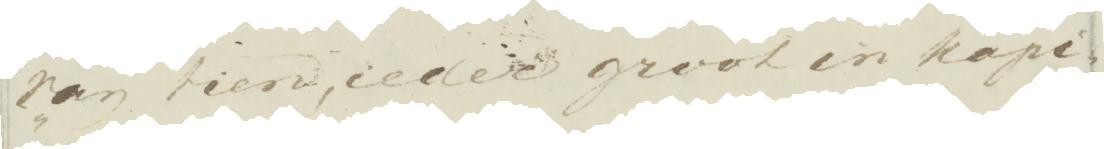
„van tien, ieder groot in kapi„
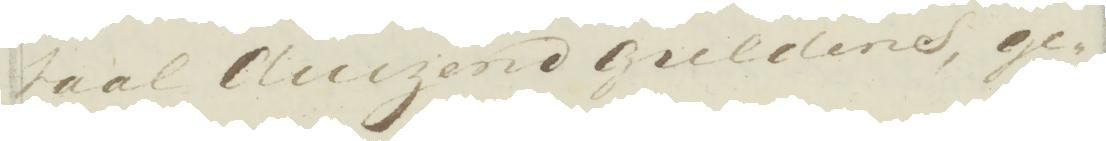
taal duizend guldens, ge„
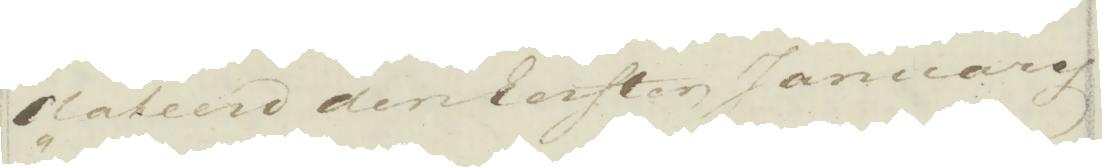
dateerd den Eersten January
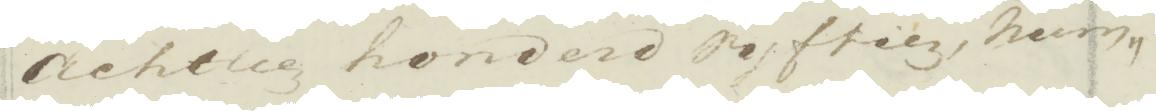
achttien honderd vijftien, num„
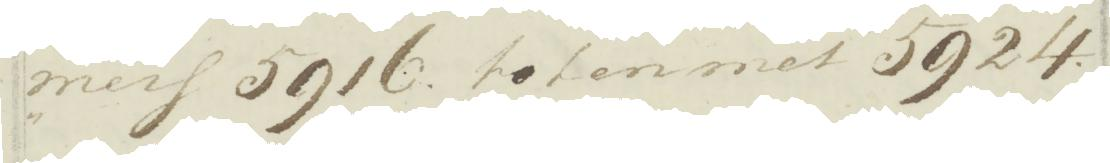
„mers 5916. tot en met 5924.
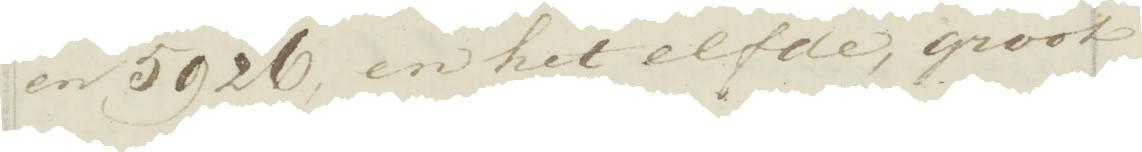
en 5926, en het elfde, groot
